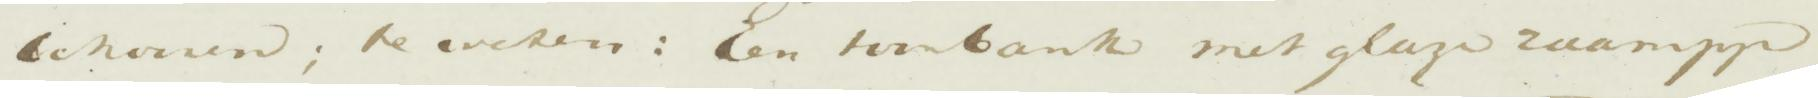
behooren; te weten: Een toonbank met glaze raampje,
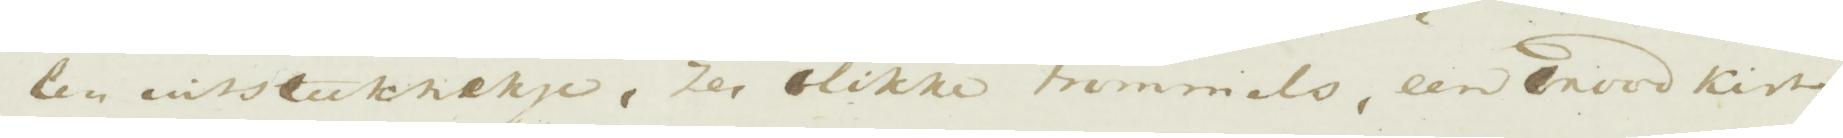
Een uitsteekbakje, zes blikke trommels, een brood kist,
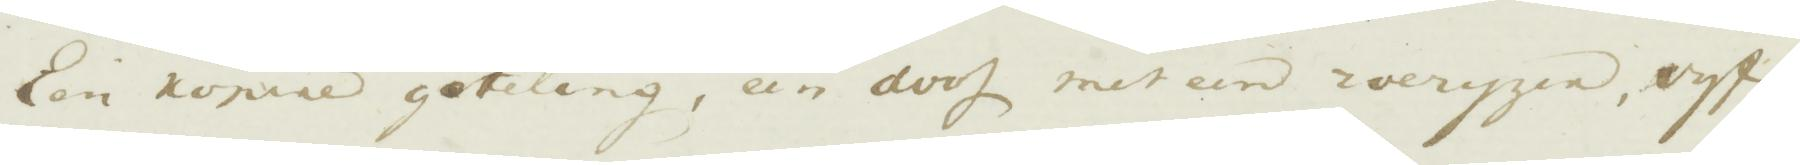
Een kopere goteling, een doos met een roeryzer, vyf
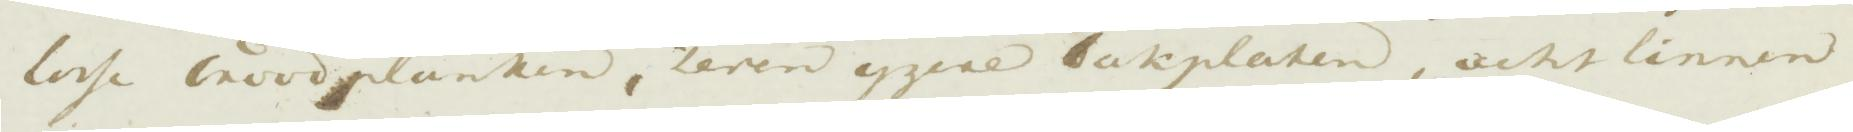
losse broodplanken, zeven yzere bakplaten, acht linnen
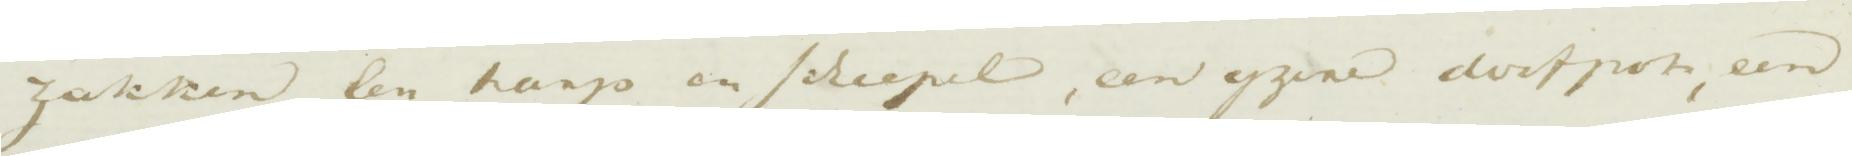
zakken Een harp en scheepel, een yzere doofpot, een
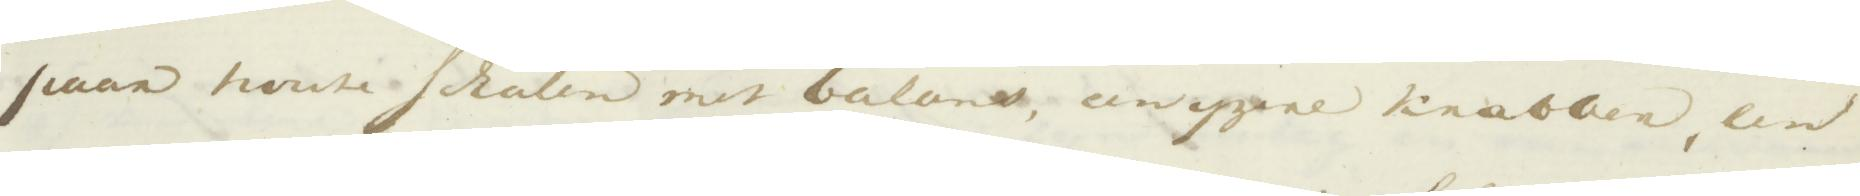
paar houte schalen met balans, een yzere knabber, een
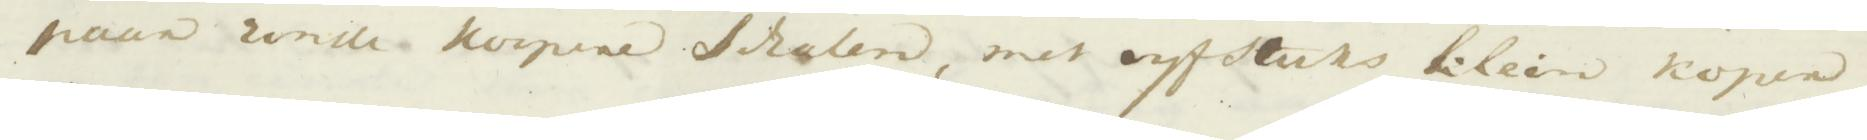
paar ronde koopere schalen, met vyf stuks klein koper
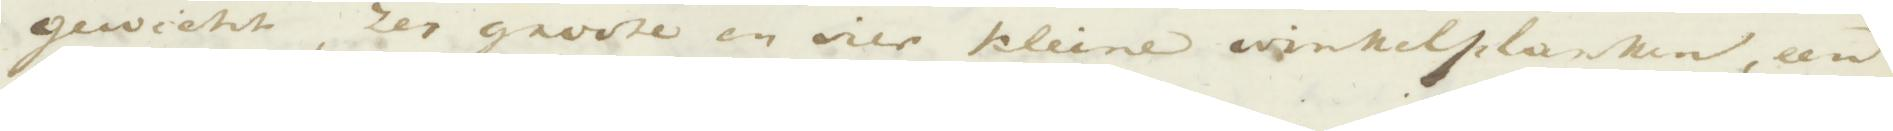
gewicht, zes groote en vier kleine winkelplanken, een
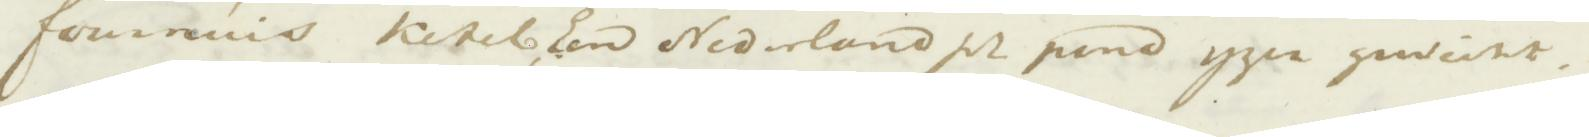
fornuis ketel, Een Nederlandsch pond yzer gewicht.
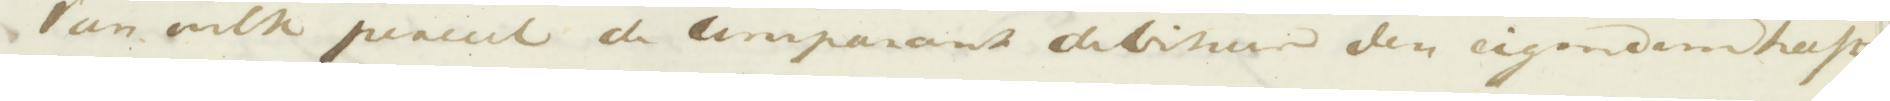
Van welk perceel de Comparant debiteur den eigendom heeft
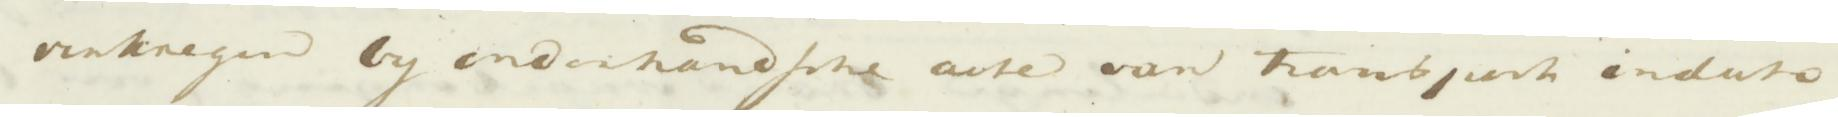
verkregen by onderhandsche acte van transport in dato
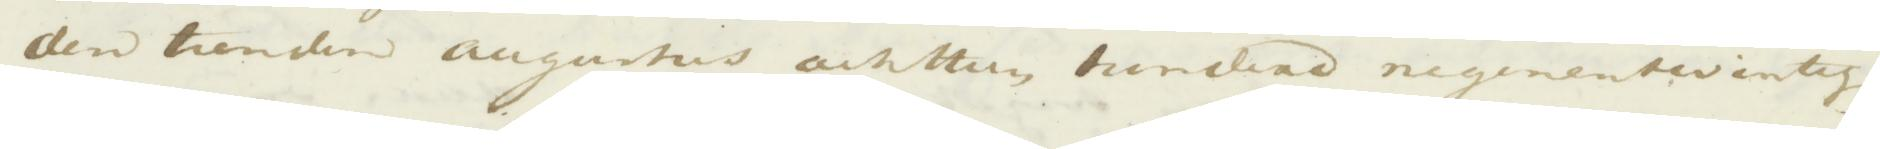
den tienden augustus achttien honderd negenentwintig
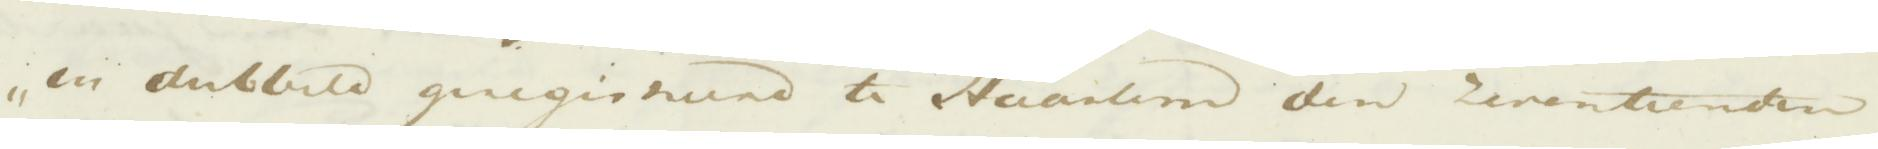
„en dubbeld geregistreerd te Haarlem den zeventienden
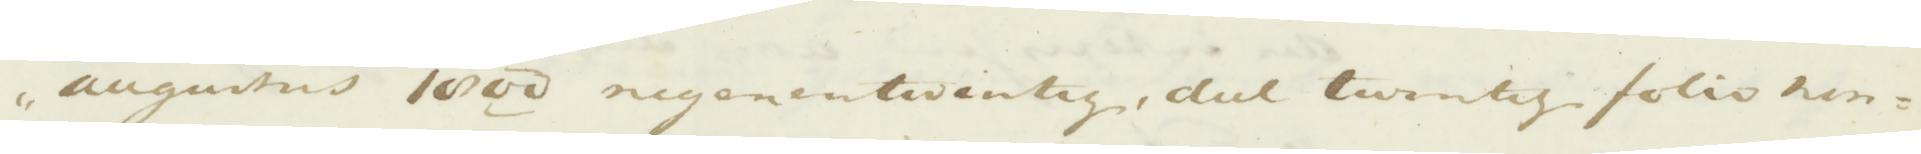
„augustus 1800 negenentwintig, deel twintig folio hon=
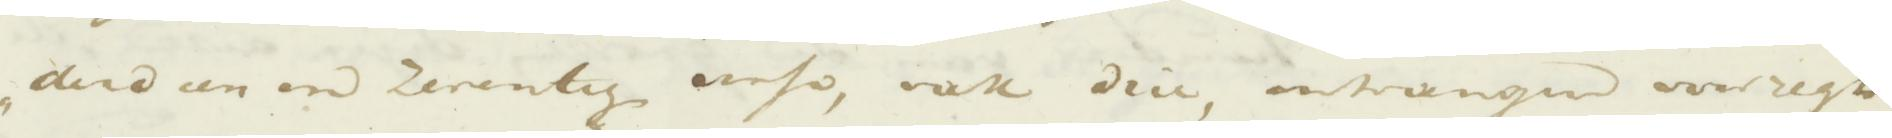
„derd een en zeventig verso, vak drie, ontvangen over regt
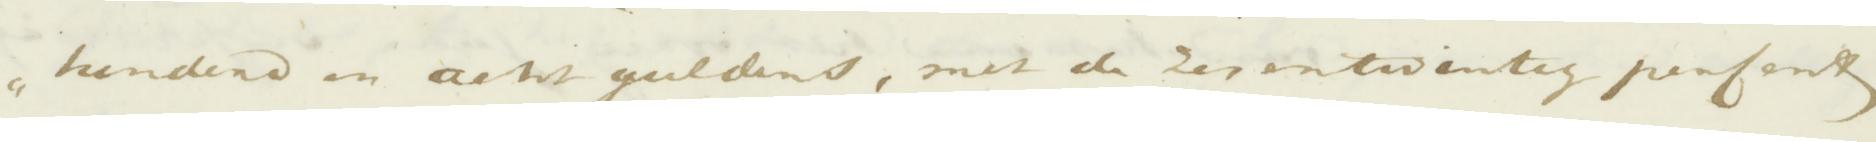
„honderd en acht guldens, met de zesentwintig percent
